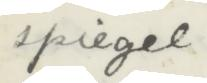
spiegel
